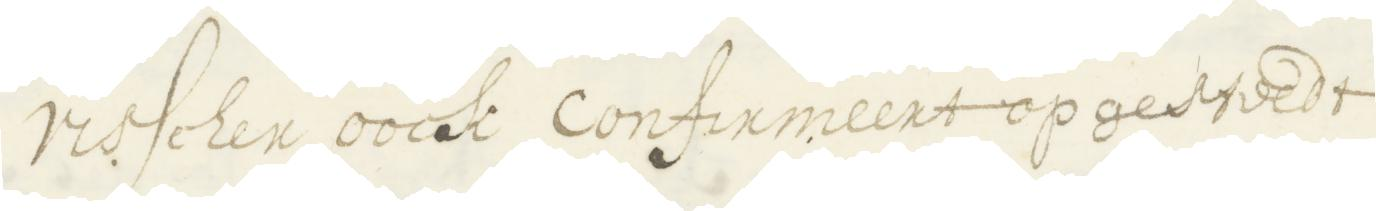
visscher oock confirmeert op gesteldt
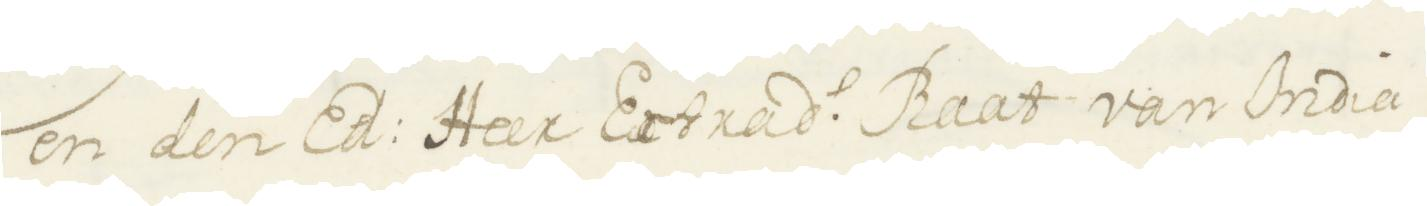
en den Ed: Heer Extrad:s Raat van India
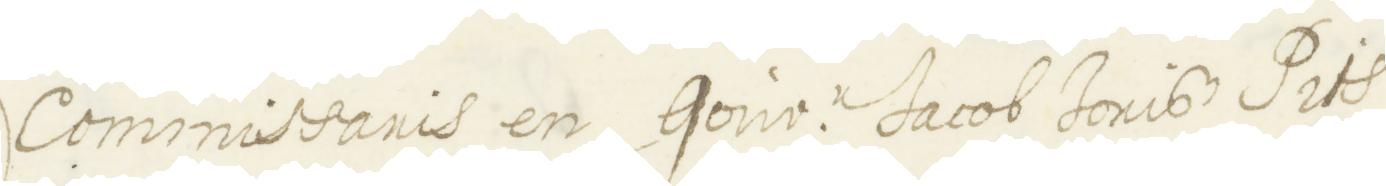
Commissaris en Gouv:r Iacob Ioris Pit's
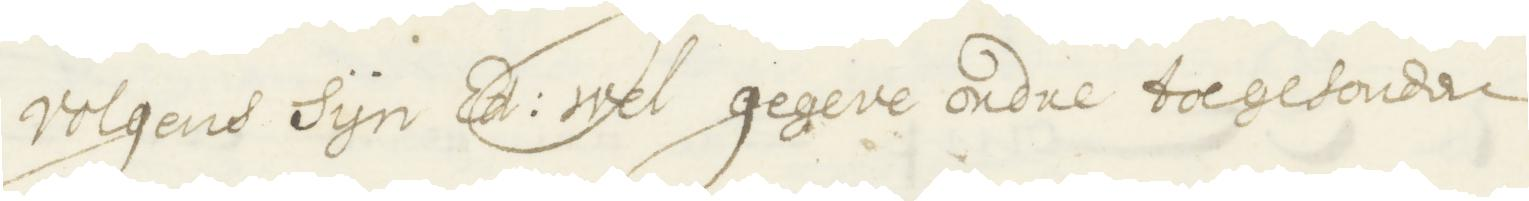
volgens Sijn Ed: wel gegeve ordre toegesonden
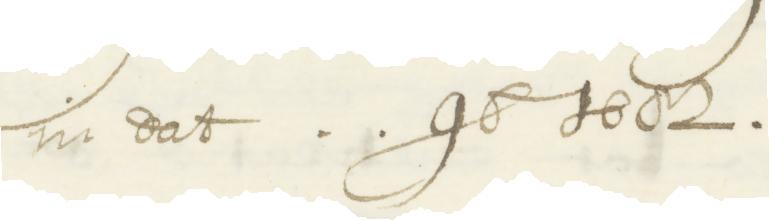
in dat . . 9b 1682.
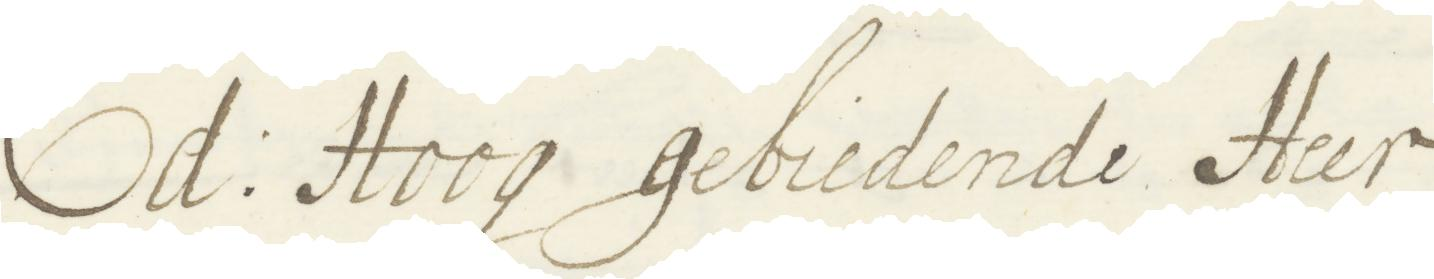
Ed: Hoog gebiedende Heer
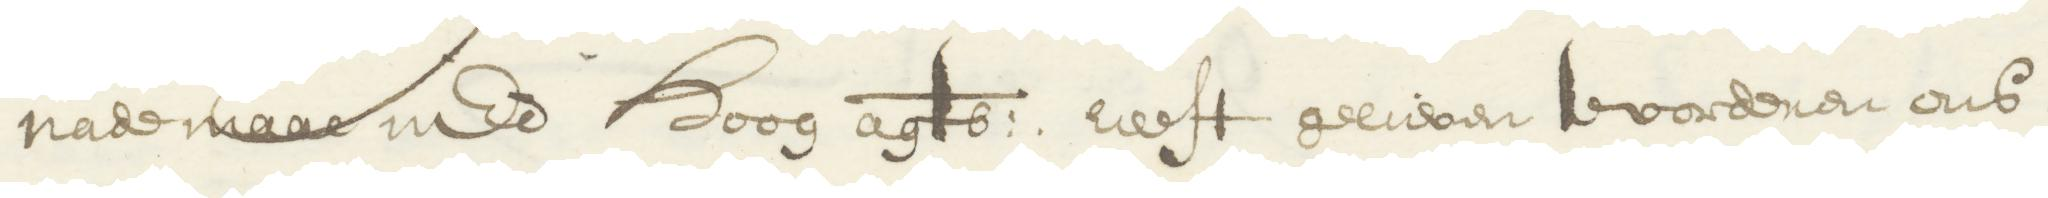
nademaal uEd Hoog agtb:: heeft gelieven te vorderen ons
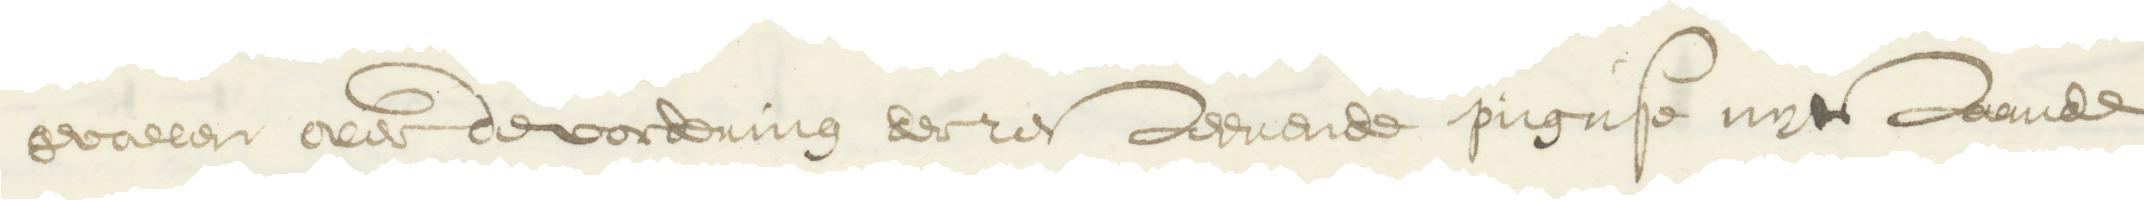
gevallen over de vordering der resteerende pinguse uijtstaande
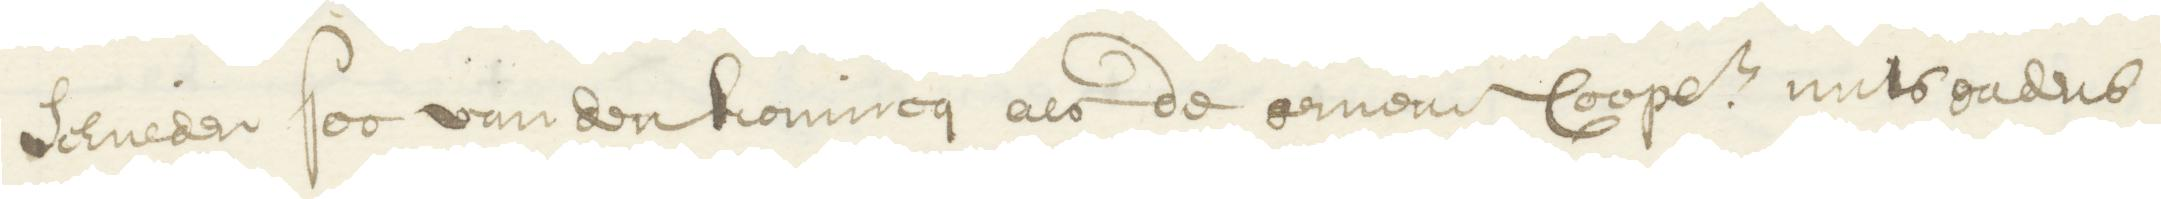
Schulden Soo van den konincq als de gemene Coopl.n mitsgaders
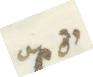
op d'
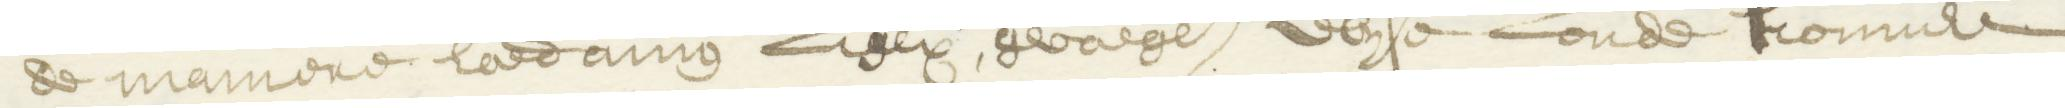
de maniere hoedanig Zulx, gevoeglijk wijse Zoude konnen
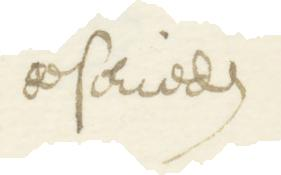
geschieden
